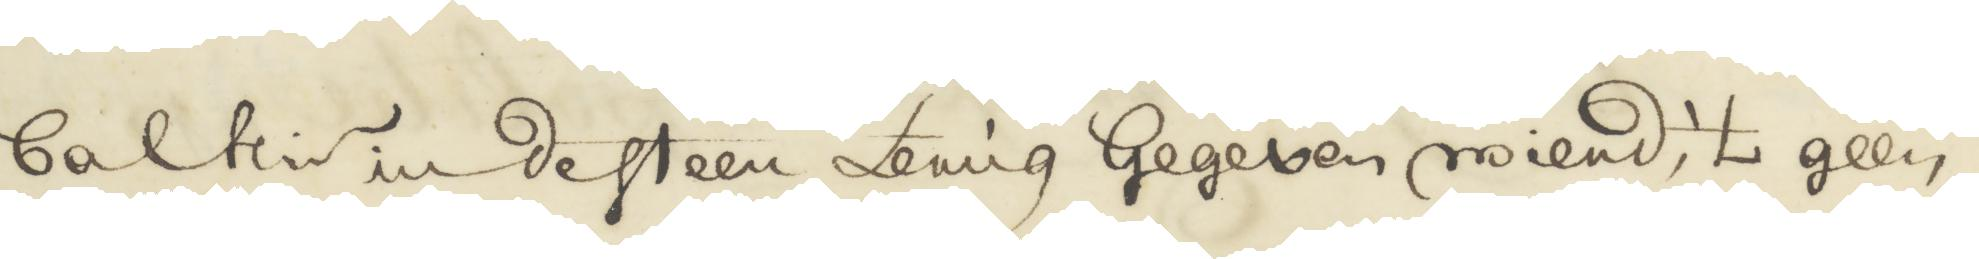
balkie in de steen terug gegeven wierd, ’t geen
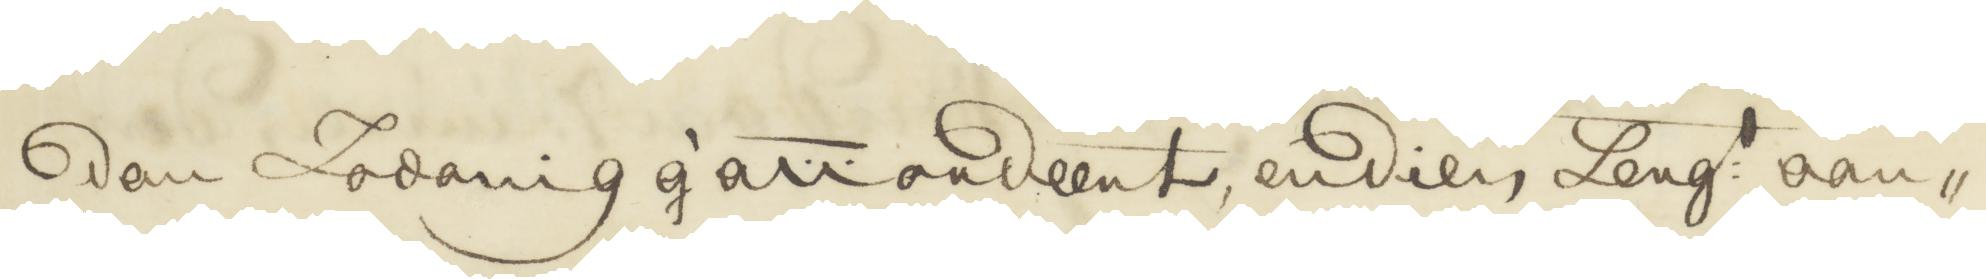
dan zodanig g’accordeert, en dien serg:t aan„
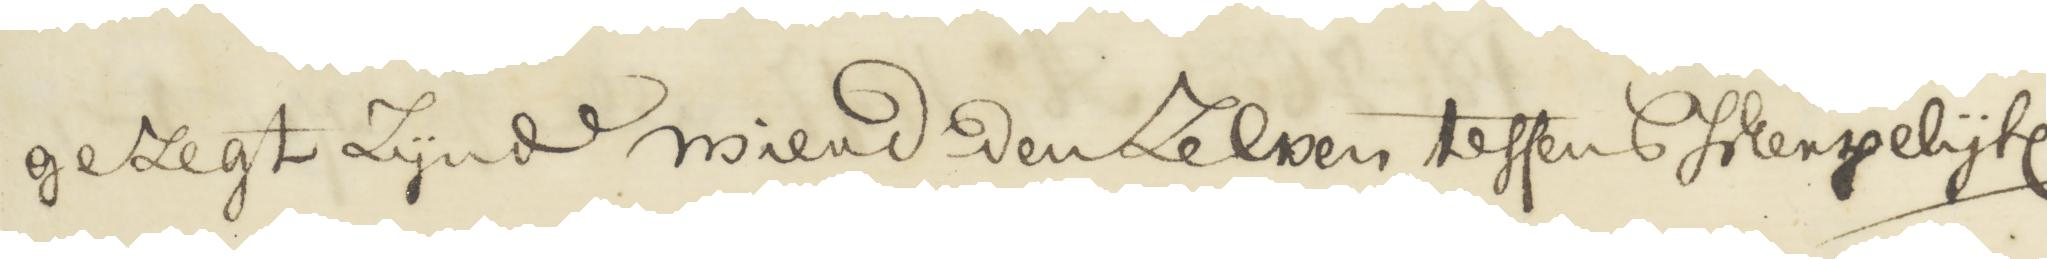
gezegt zijnde wierd den zelven teffens scherpelijk
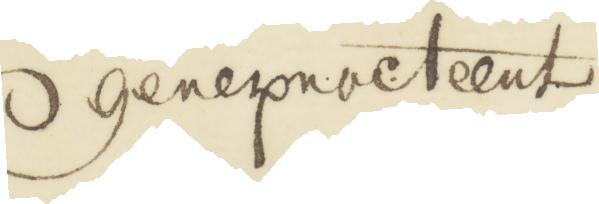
gereprocteert
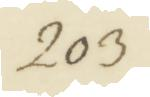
203
